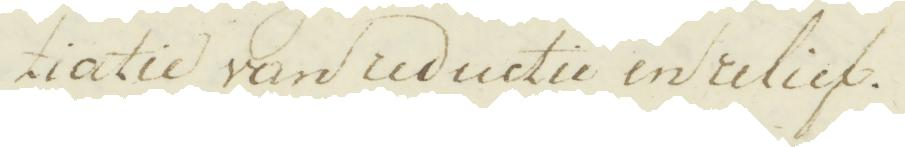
tiatie van reductie en relief.
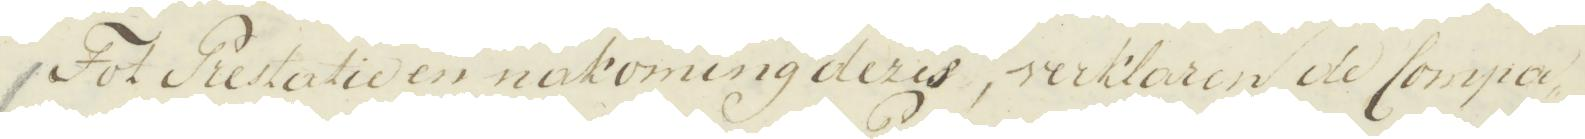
Tot Prestatie en nakoming dezes, verklaren de Compa„
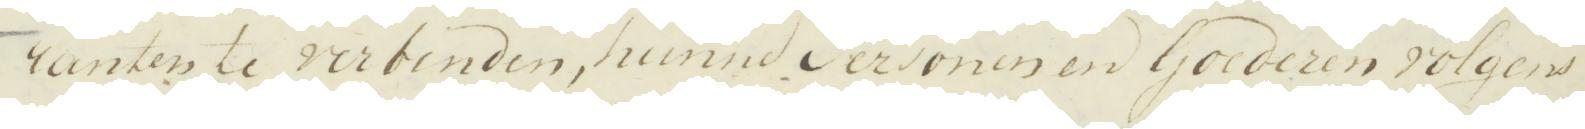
ranten te verbinden, hunne Personen en Goederen volgens
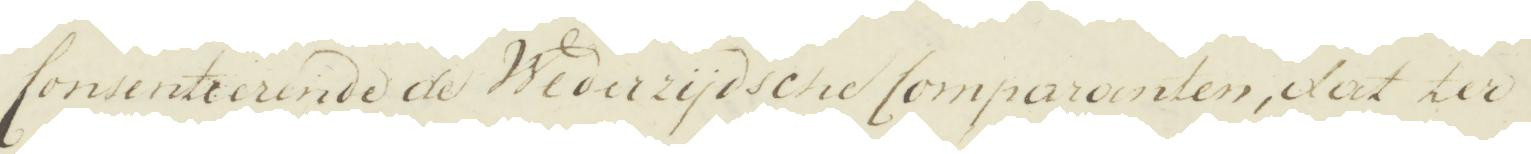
Consenteerende de Wederzijdsche Comparanten, dat ter
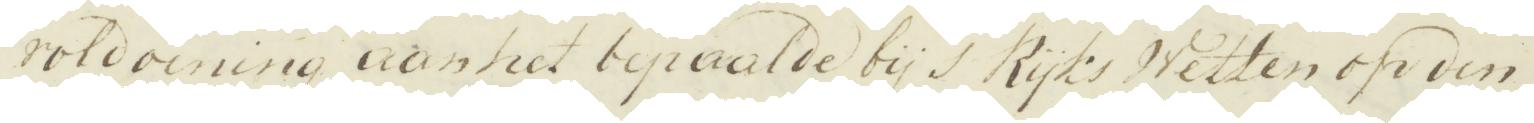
voldoening aan het bepaalde bij ’s Rijks Wetten op den
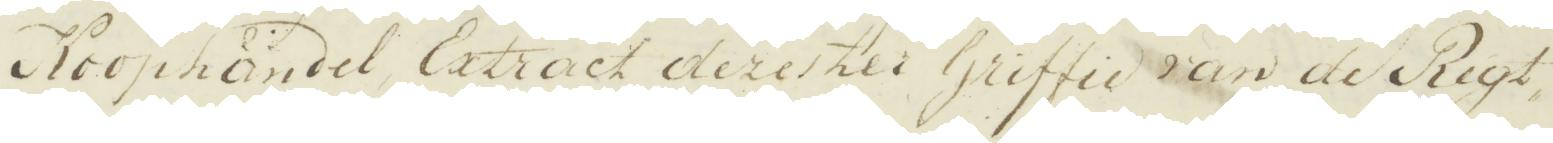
Koophandel, Extract dezes ter Griffie van de Regt„
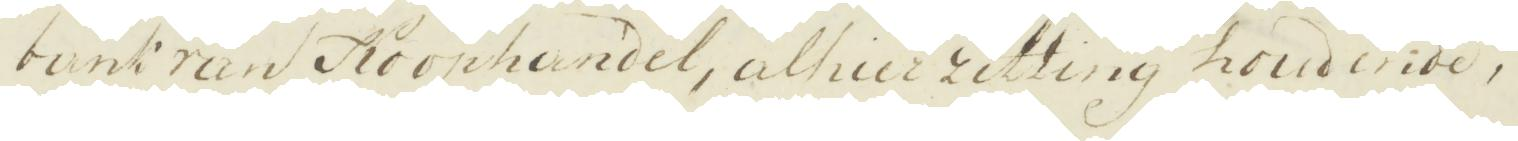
bank van Koophandel, alhier zitting houdende,
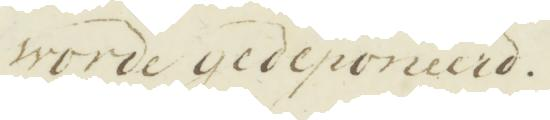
worde gedeponeerd.
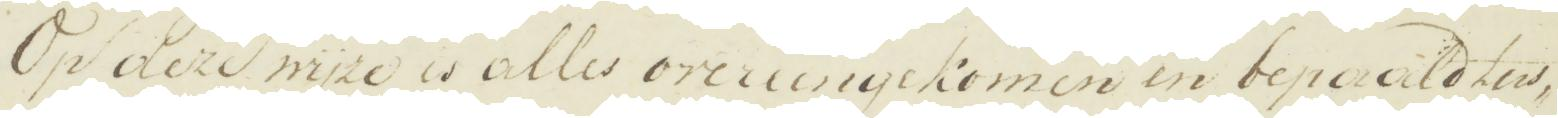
Op deze wijze is alles overeengekomen en bepaald tus„
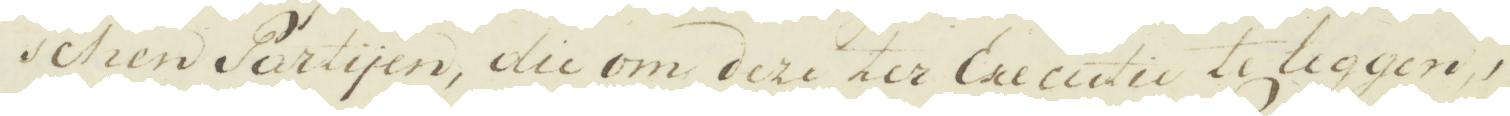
schen Partijen, die om deze ter Executie te leggen,
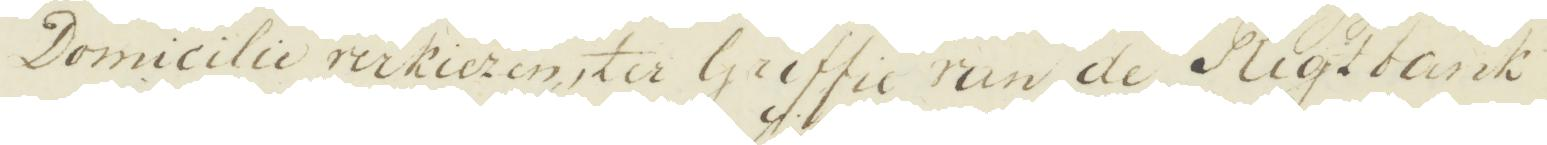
Domicilie verkiezen, ter Griffie van de Regtbank
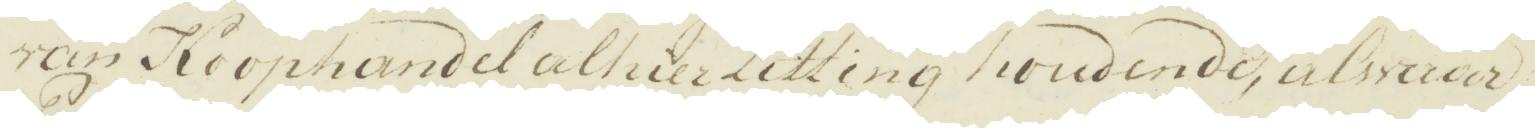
van Koophandel alhier zitting houdende, alwaar
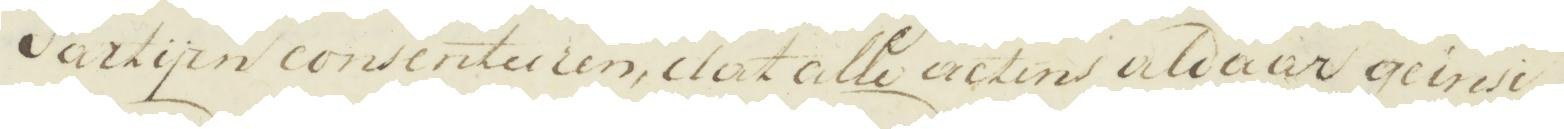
Partijen consenteeren, dat alle actens aldaar geinsi„
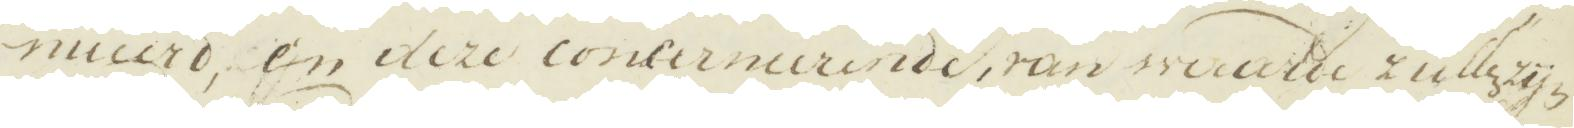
nueerd, en deze concerneerende, van waarde zullen zij
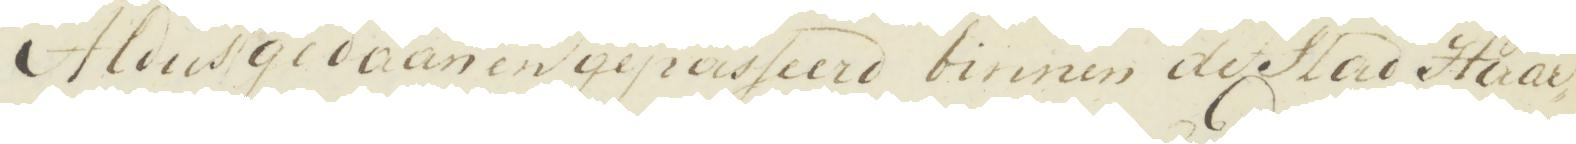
Aldus gedaan en gepasseerd binnen de stad Haar„
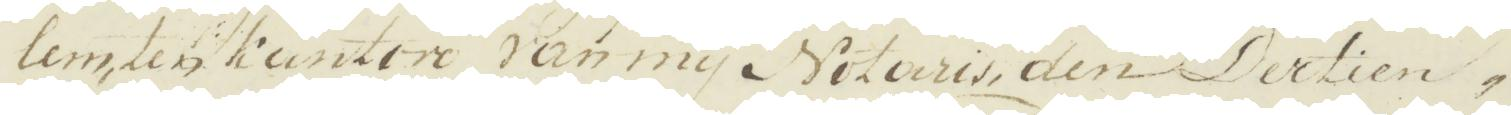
lem, ten kantore van mij Notaris, den Dertien „
